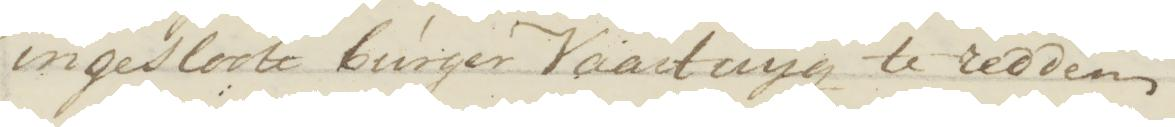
ingesloote burger Vaartuyg te redden
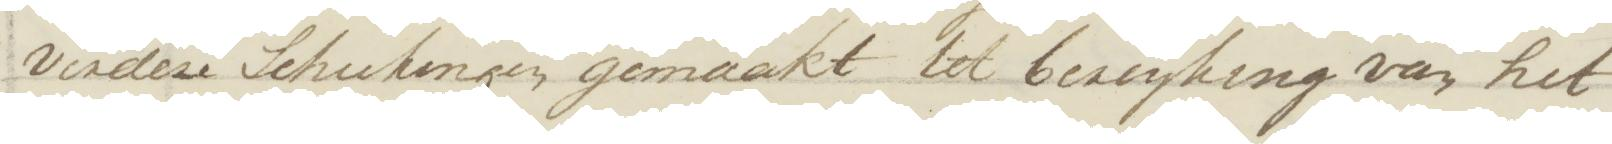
verdere Schickingen gemaakt tot bereyking van het
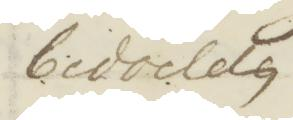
bedoelden
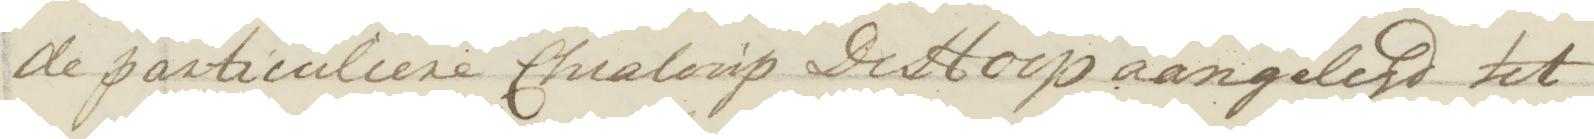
de particuliere Chialoup De Hoop aangelegd tot
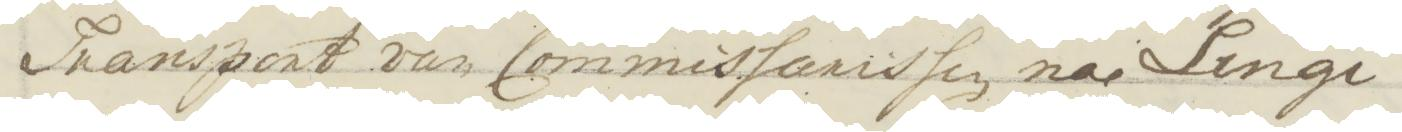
Transport van Commissarissen na Lingi
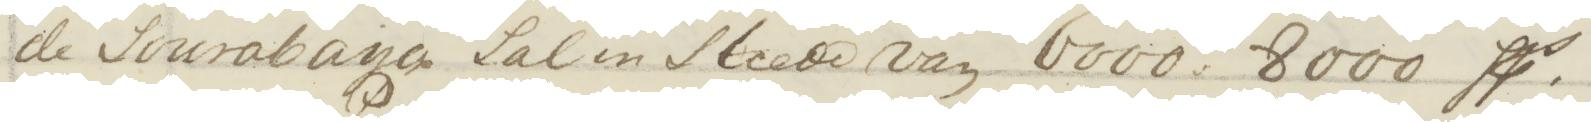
de Sourabaija Sal in steede van 6000: 8000 sp.s
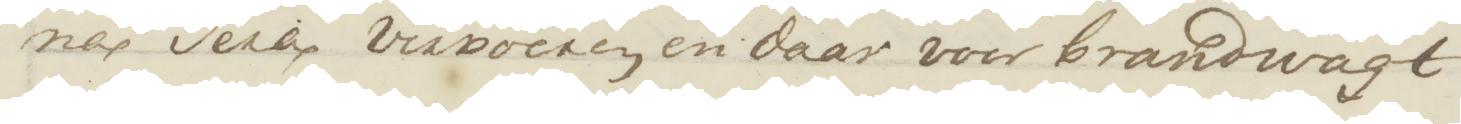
na Pera vervoeren en daar voor brandwagt
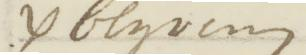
verblyven.
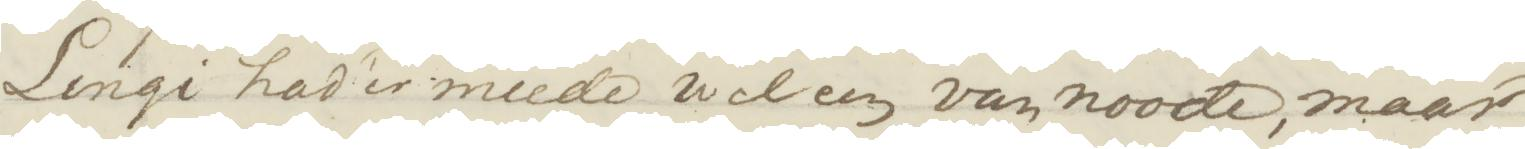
Lingi had er meede wel een van noode, maar
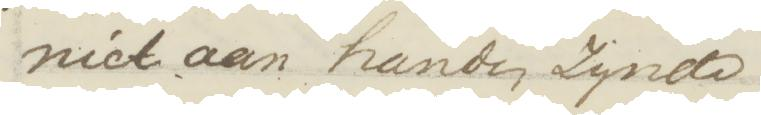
niet aan handen Zijnde
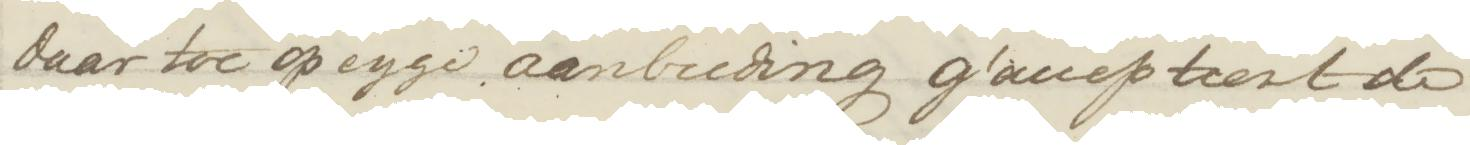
daar toe op eyge aanbieding g'accepteert de
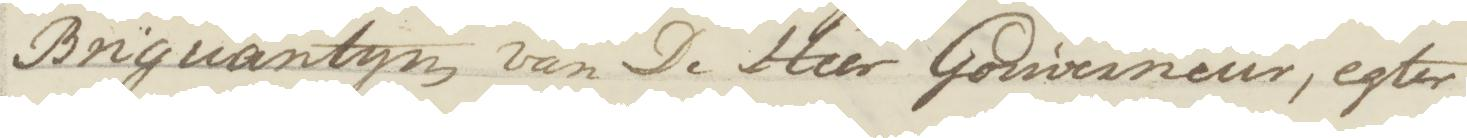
Briguantijn van De Heer Gouverneur, egter
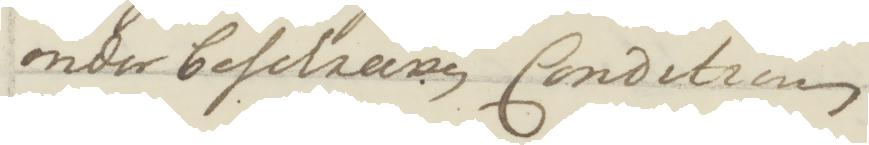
onder beschreeven Conditien
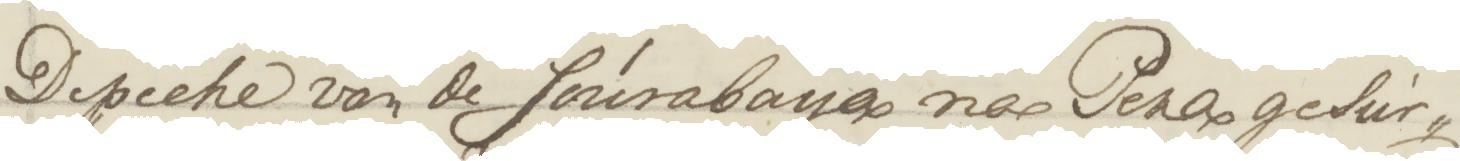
Depeche van de Sourabaija na Pera gesur„
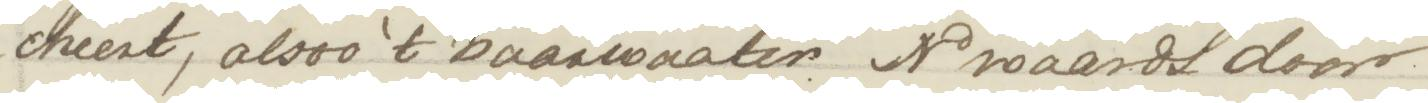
-cheert, alsoo 't vaarwaater N:d waards door
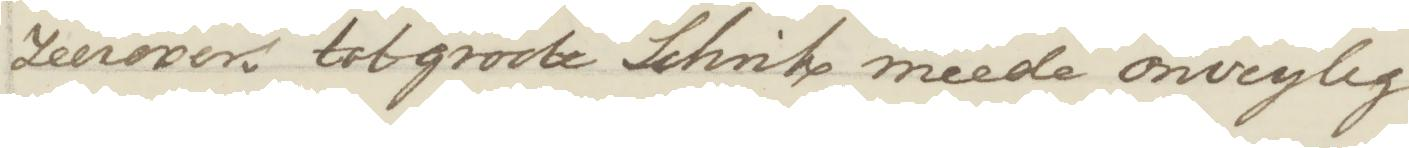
zeerovers tot groote schrik meede onveylig
